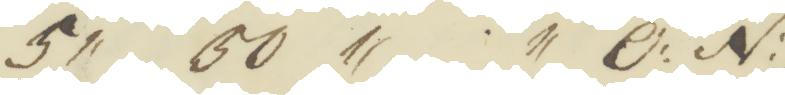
5 „ 50 „ „ O: N:
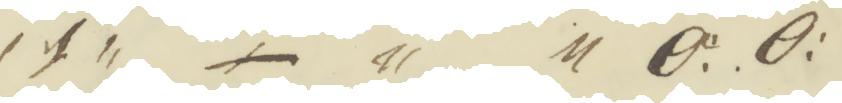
1 „ — „ „ O: O:
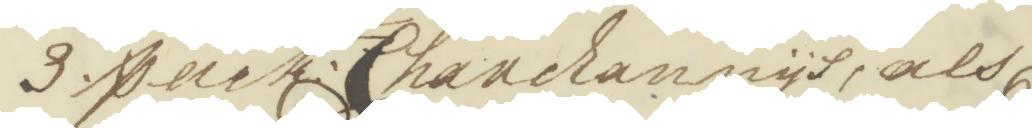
3. pack: Charchannijs, als
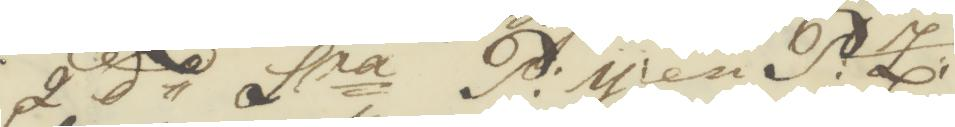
2 d„o L=ra P: ij: en P: Z:
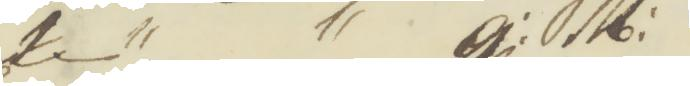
„ q: M:
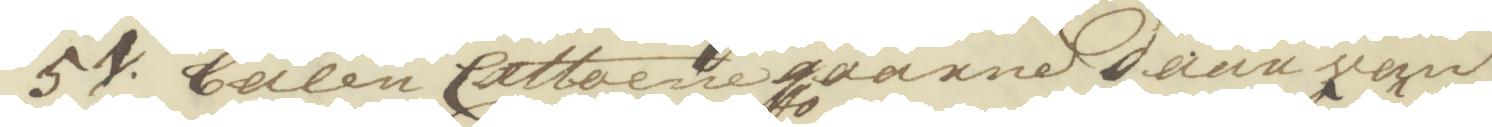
51. balen Cattoene gaarne daar van
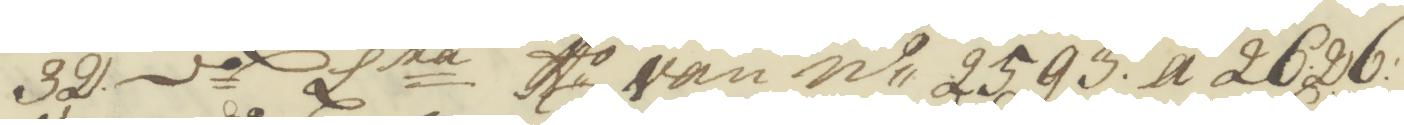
32 _=o L=ra A„o van n„o 2595. â 2626:
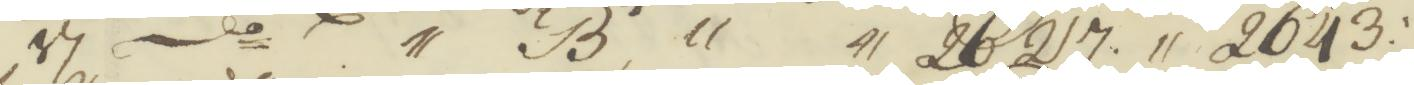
17 _=o „ B „ „ 2627. „ 2643:
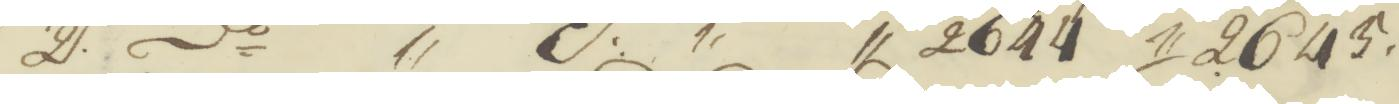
2 _=o „ C: „ „ 2644 „ 2645.
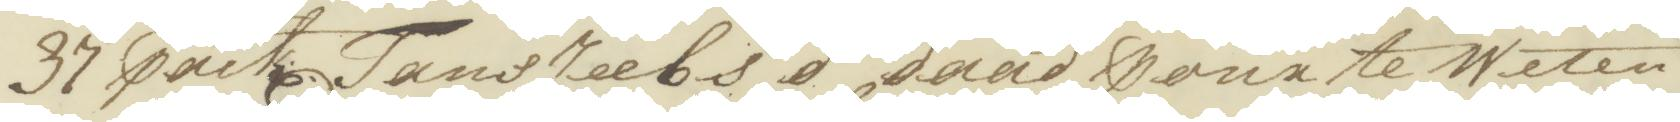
37 pack: Tansjeebs d' daad pour te weten
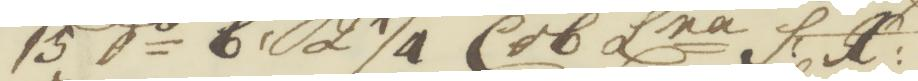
15 d=o b: 2¼ Cob L=ra S: X:
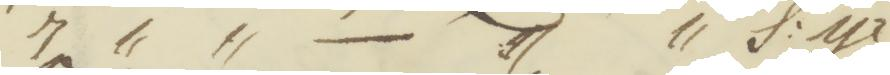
7 „ „ — „ „ S: Y:
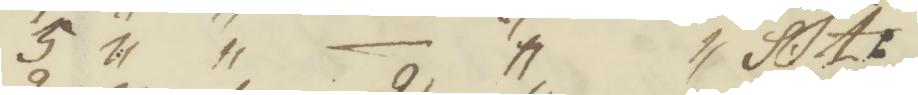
5 „ „ — „ „ S: t:
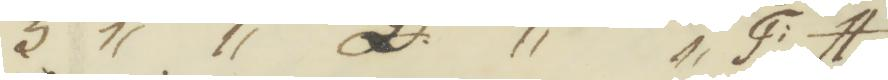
3 „ „ 2 „ „ T: A:
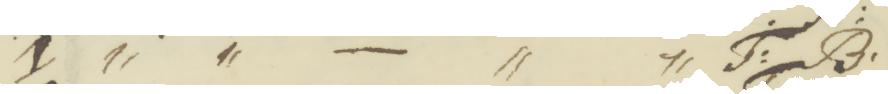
1 „ „ — „ „ T: B:
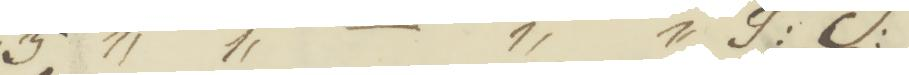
5 „ „ — „ „ T: C:
